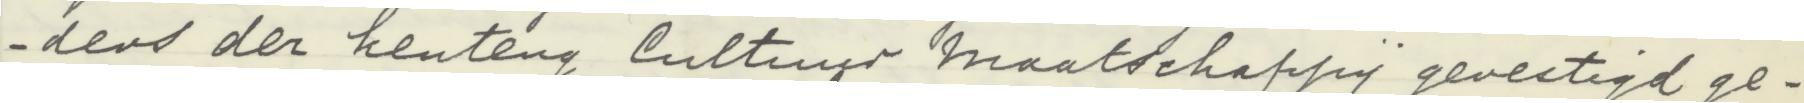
-ders der kenteng Cultuur maatschappij gevestigd ge-
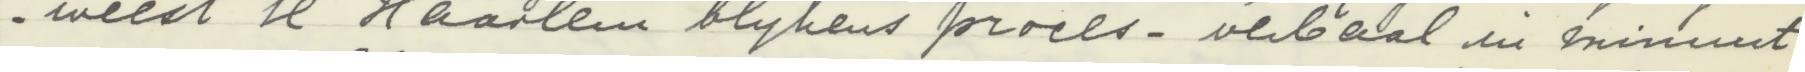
-weest te Haarlem blijkens proces - verbaal in minuut
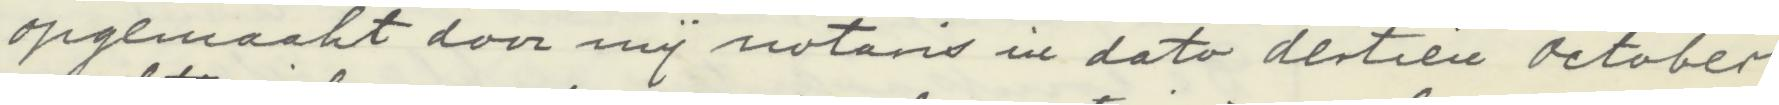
opgemaakt door mij notaris in dato dertien october
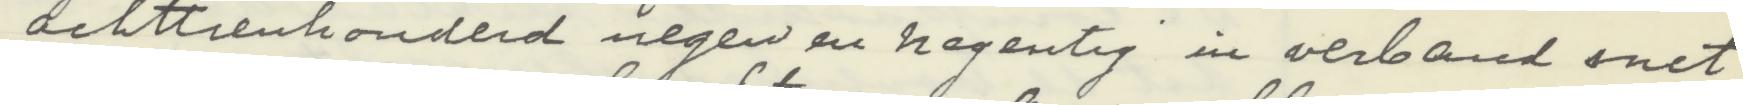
achttienhonderd negen en negentig in verband met
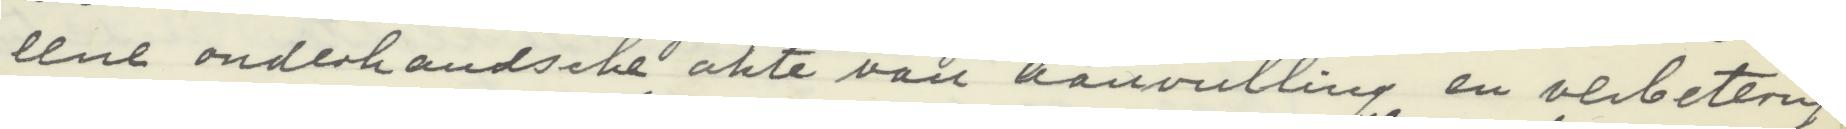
eene onderhandsche akte van aanvulling en verbetering
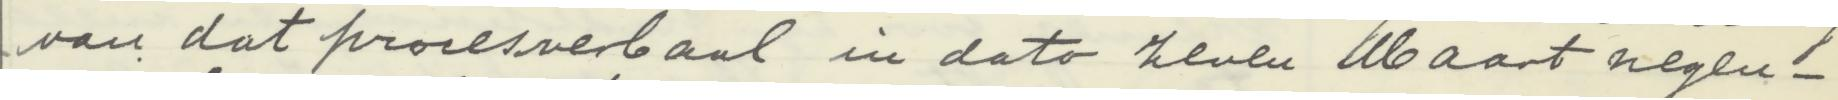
van dat procesverbaal in dato zeven Maart negen-
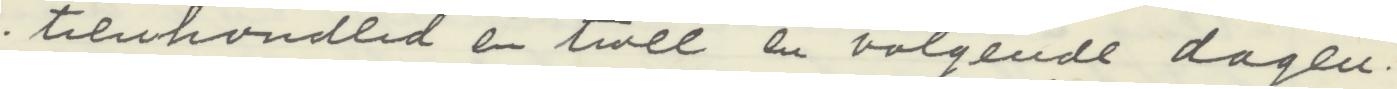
tienhonderd en twee en volgende dagen
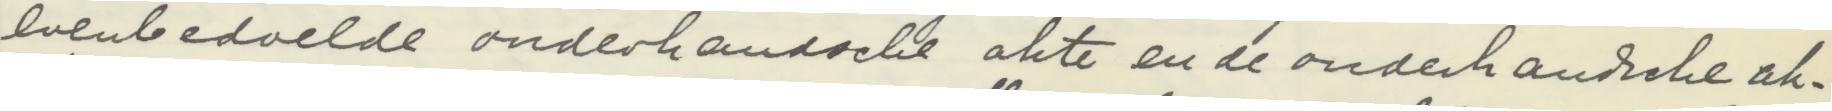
Evenbedoelde onderhandsche akte en de onderhandsche ak-
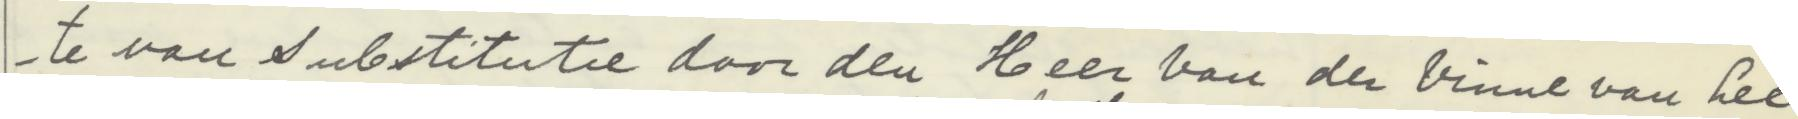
-te van substitutie door den Heer van den Vinne van Lee
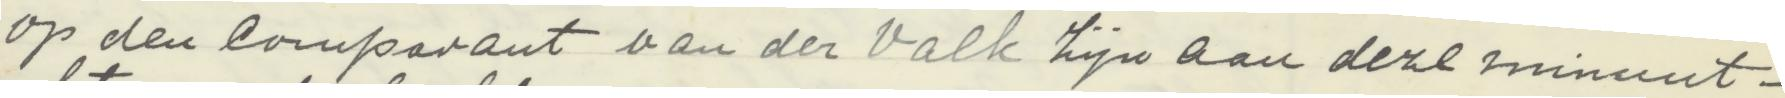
op den comparant van der Valk zijn aan deze minuut-
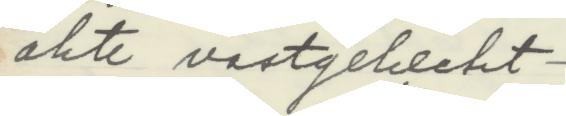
akte vastgehecht
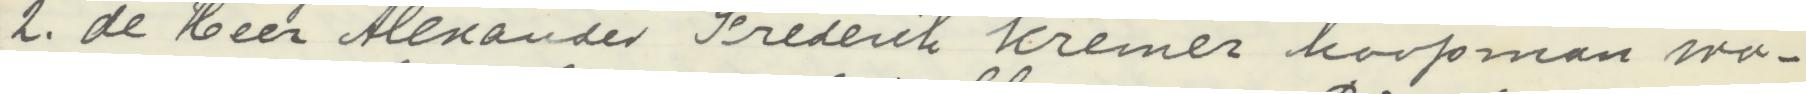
2. de Heer Alexander Frederik Kremer koopman wo-
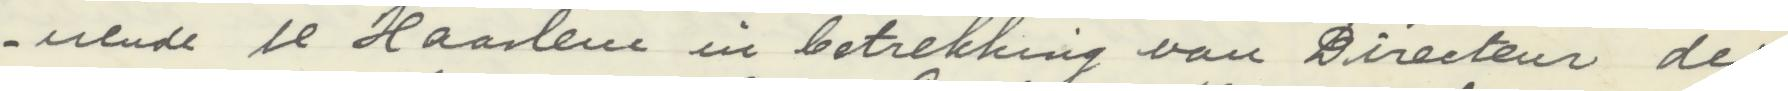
-nende te Haarlem in betrekking van Directeur der
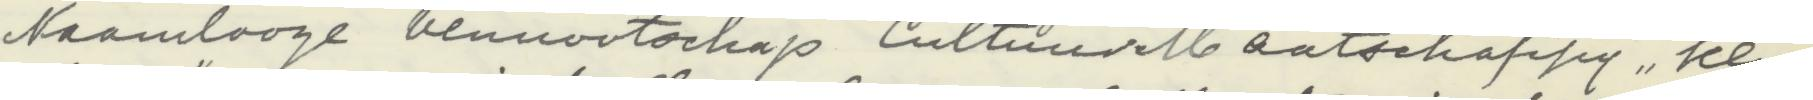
Naamlooze vennootschap Cultuur Maatschappij „ ken-
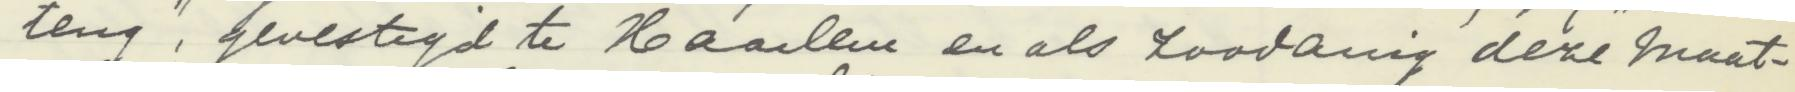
teng ", gevestigd te Haarlem en als zoodanig deze maat-
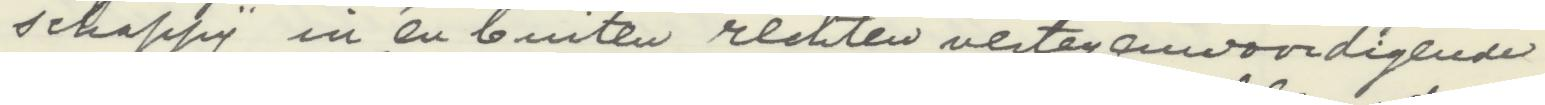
schappij in en buiten rechten vertegenwoordigende
